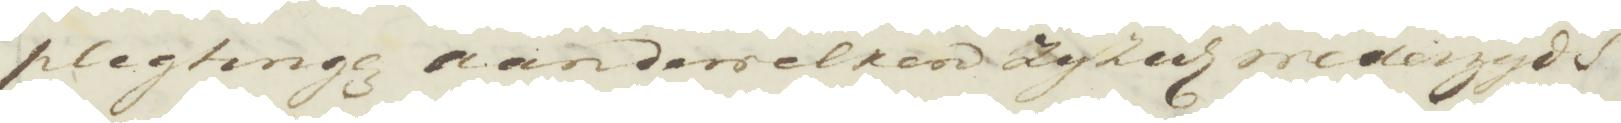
pligtingen aan dewelken zy zich wederzyds
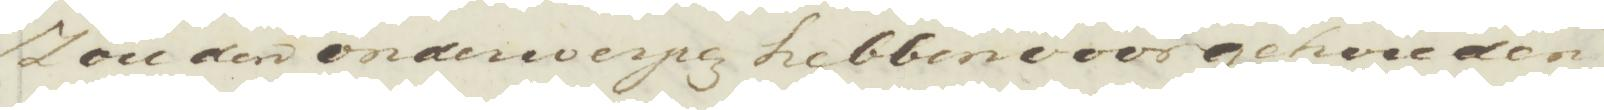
zouden onderwerpen hebben voorgehouden
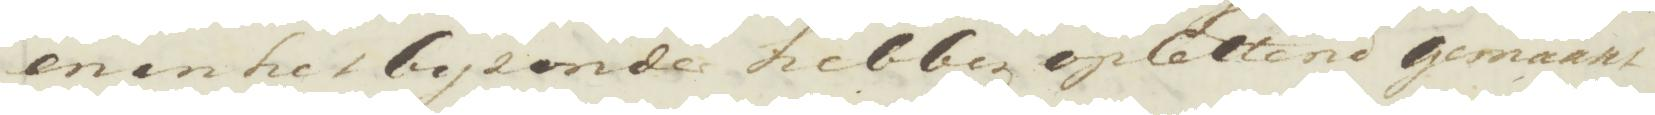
en in het byzonder hebben oplettend gemaakt
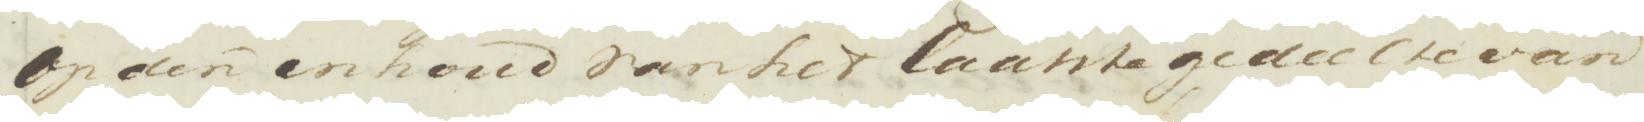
op den inhoud van het laatste gedeelte van
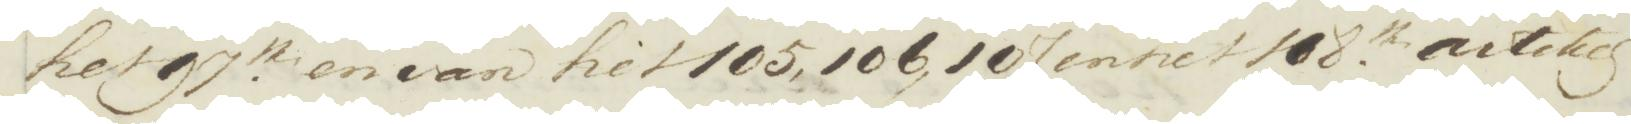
het 97.sten en van het 105, 106, 107 en het 108.sten artikel
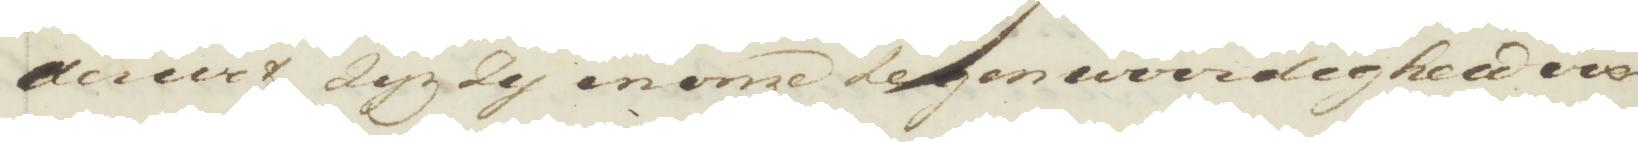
der wet zyn zy in onze tegenwoordigheid over
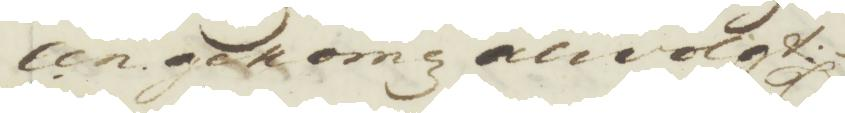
een gekomen als volgt:
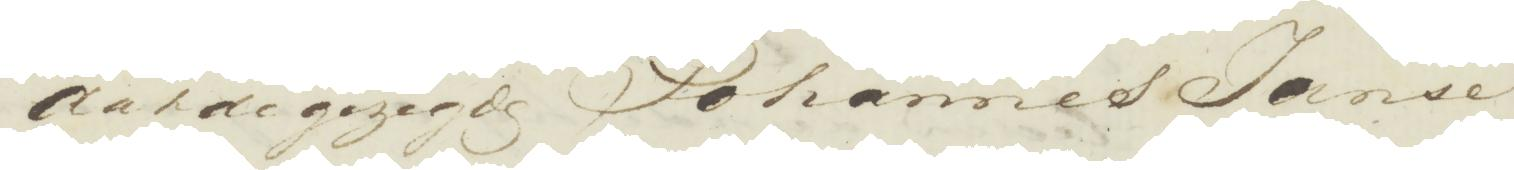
dat de gezegde Iohannes Ianse
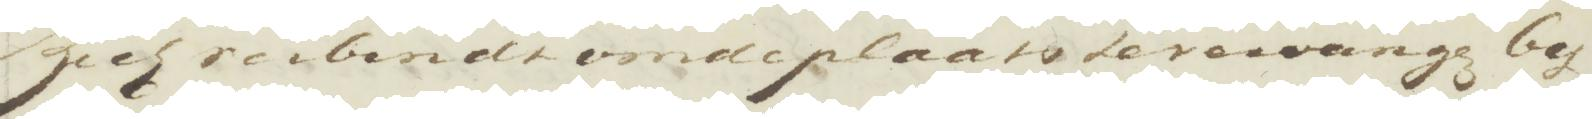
Zich verbindt voor de plaats te vervangen by
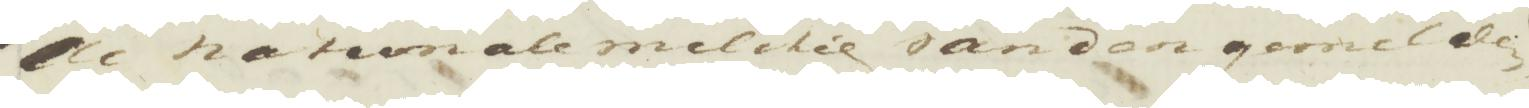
de nationale militie van den gemelden
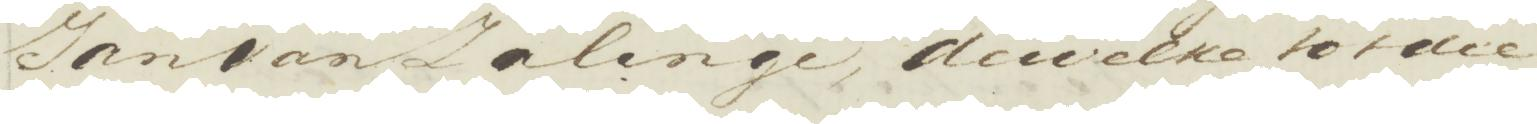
Ian van Zalinge, dewelke tot die
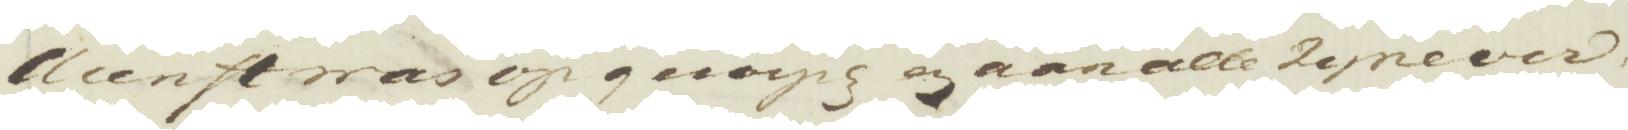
dienst was opgeroepen en aan alle zyne ver
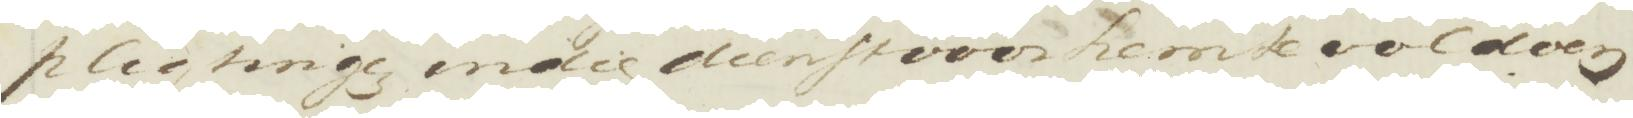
pligtingen in dien dienst voor hem te voldoen
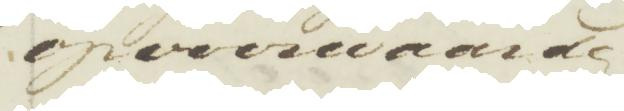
op voorwaarden
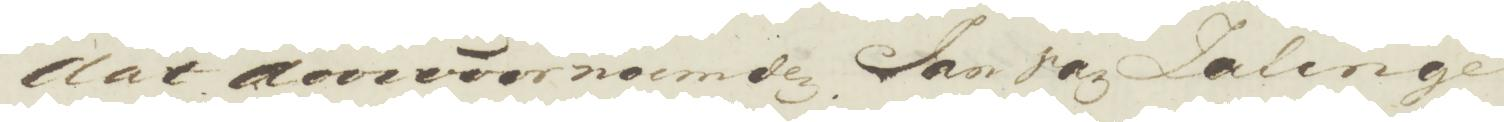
dat door voornoemde Ian van Zalinge
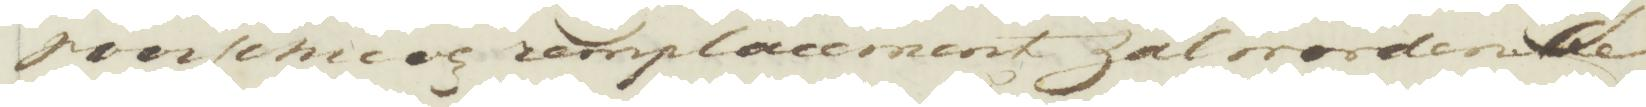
voorschreeven remplacement zal worden be
